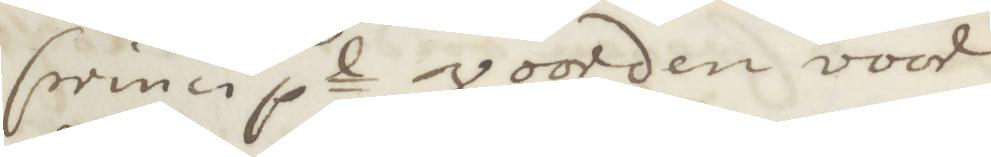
princip=l voorden voor
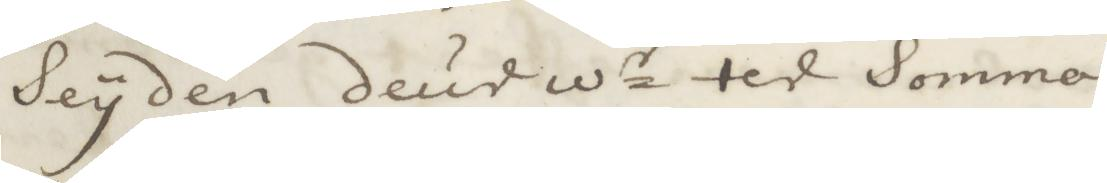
seijden deurw=r ter somma
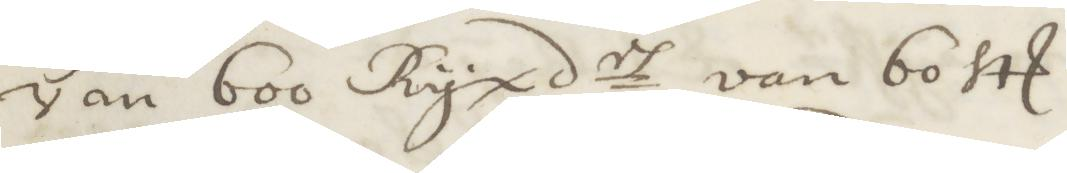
van 600 Rijxd=rs van 60 stver
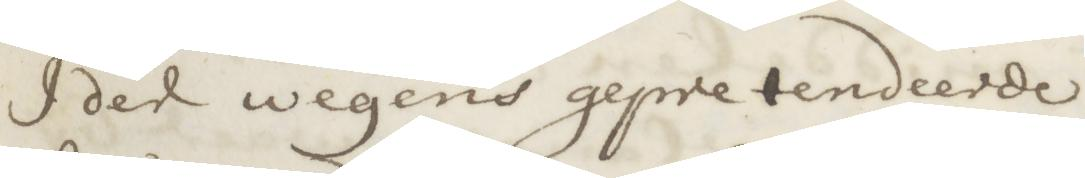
Ider wegens gepretendeerde
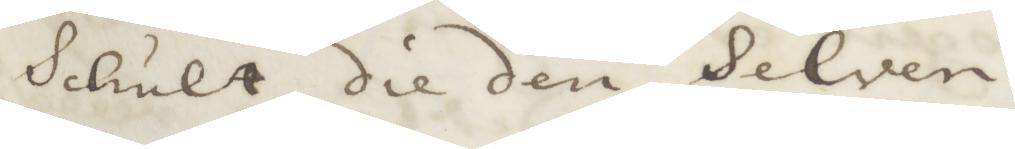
schult die den selven
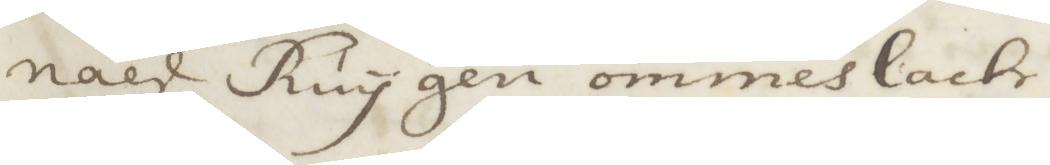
naer Ruijgen ommes lach
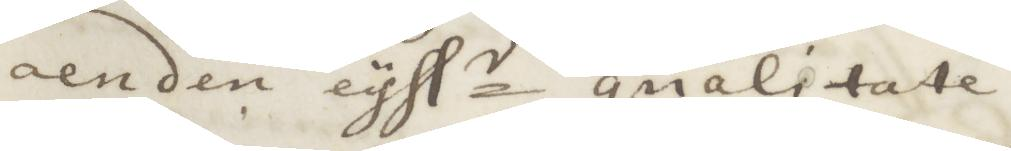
aen den eijss=r qualitate
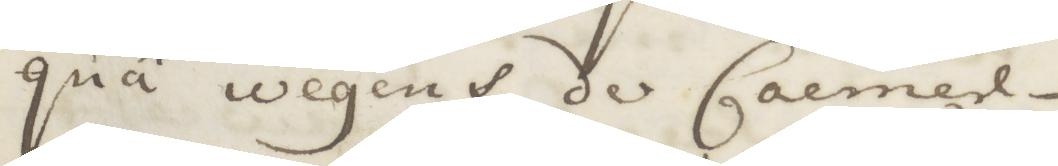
qua wegens de Caemer —
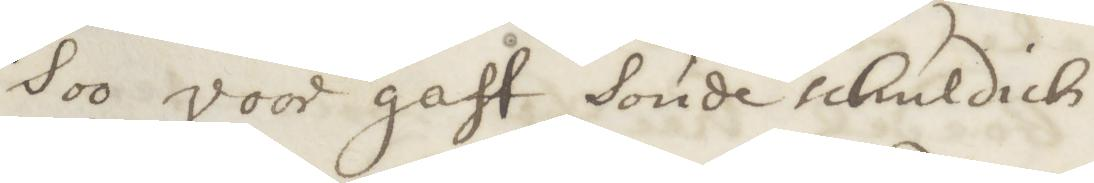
soo voor gaff soude schuldich
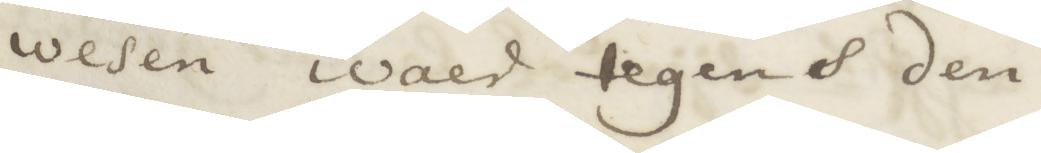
wesen waer tegens den
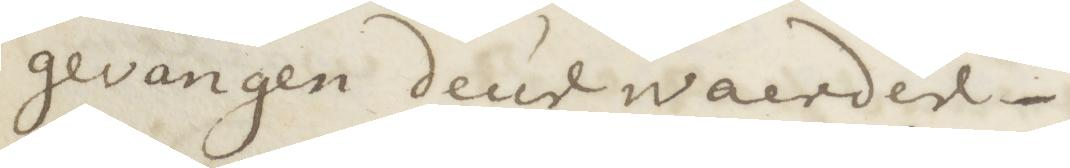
gevangen deur waerder —
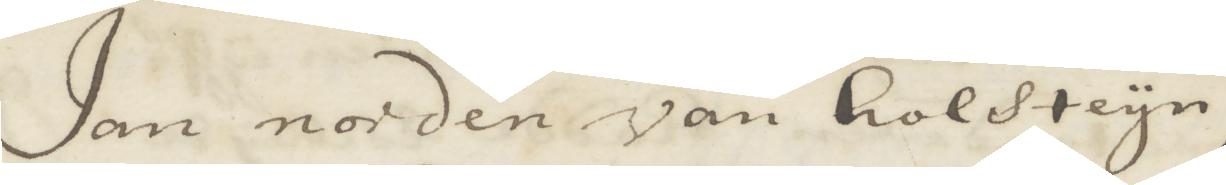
Ian norden van holsteijn
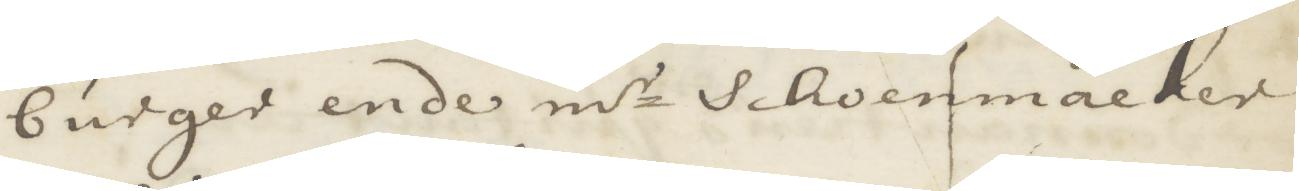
burger ende m=r schoenmaeker
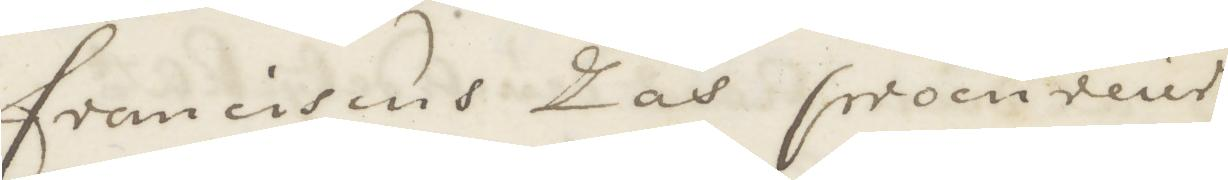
franciscus Zas procureur
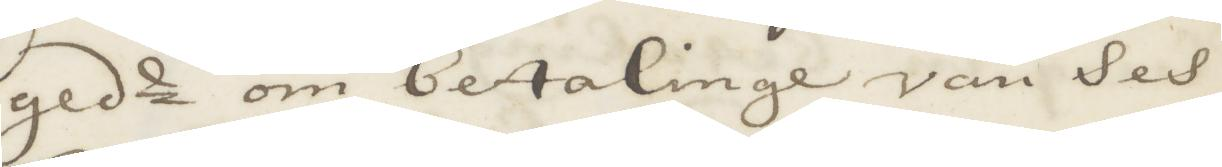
ged=e om betalinge van ses
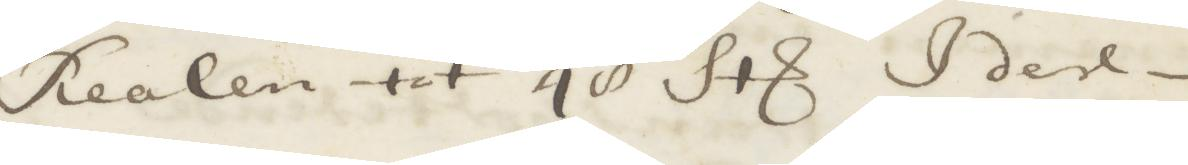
Realen tot 48 stver Ider —
